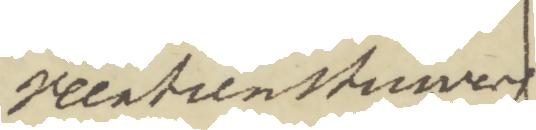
veertien stuivers
